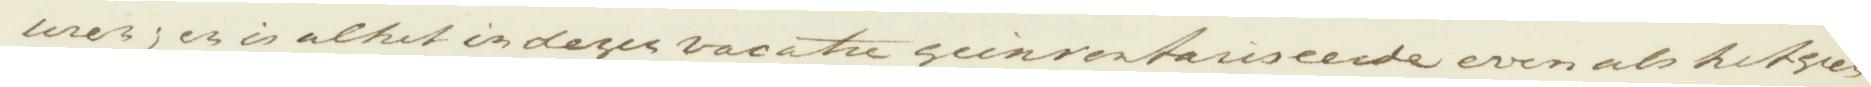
uren; en is alhet in dezen vacatie geinventariseerde even als hetgeen
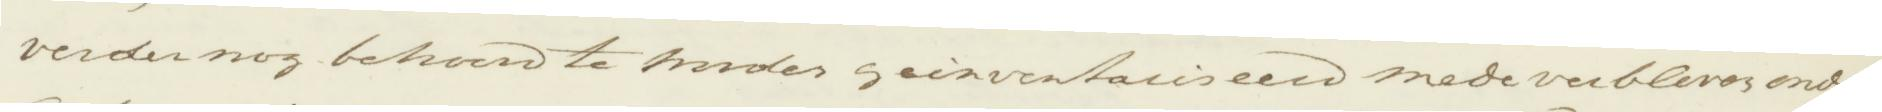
verder nog behoord te worden geinventariseerd mede verbleven onder
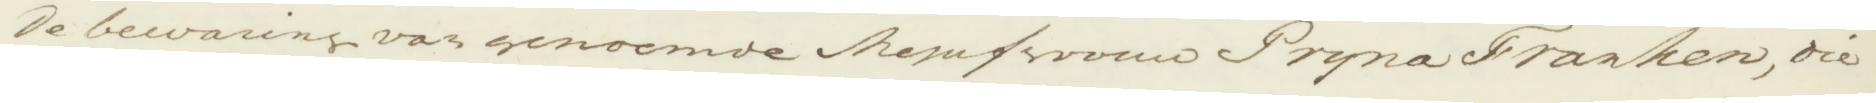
de bewaring van genoemde Mejufrouw Pryna Franken, die
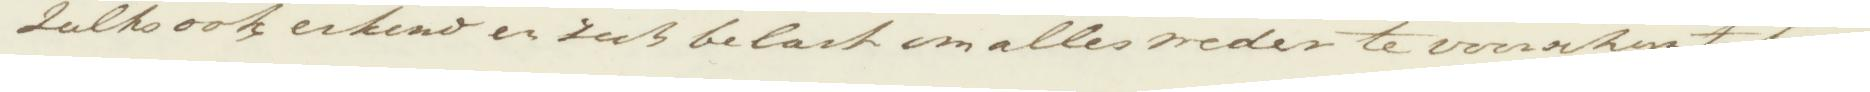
zulks ook erkend en zich belast in alles weder te voorschyn te bren„
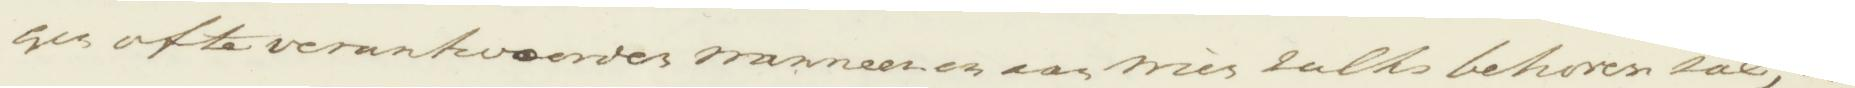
gen of te verantwoorden wanneer en aan wien zulks behoren zal; en
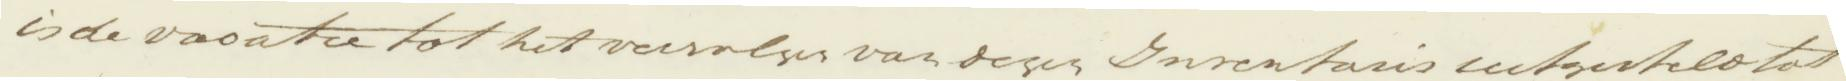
is de vacatie tot het vervolgen van dezen Inventaris uitgesteld tot
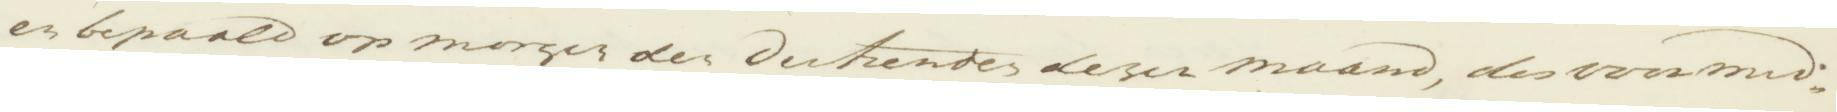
en bepaald op morgen den dertienden dezer maand, des voormid„
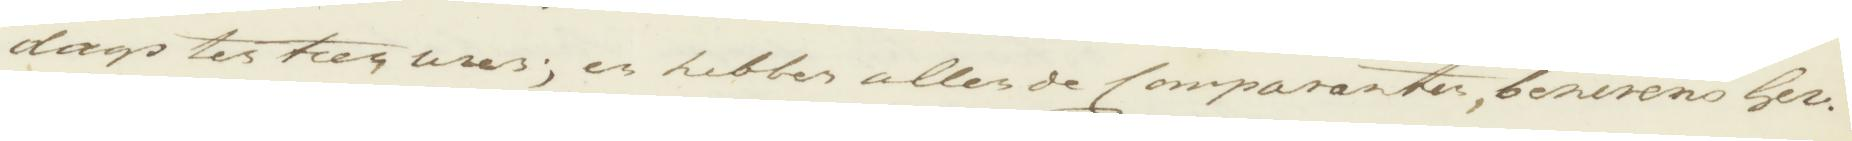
dags ten tien uren; en hebben allen de Comparanten, benevens Ger„
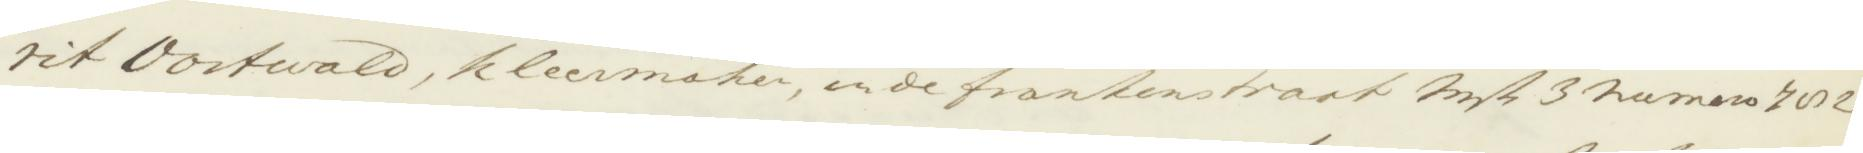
rit Oostwald, kleermaker, in de frankenstraat wyk 3 numero 782
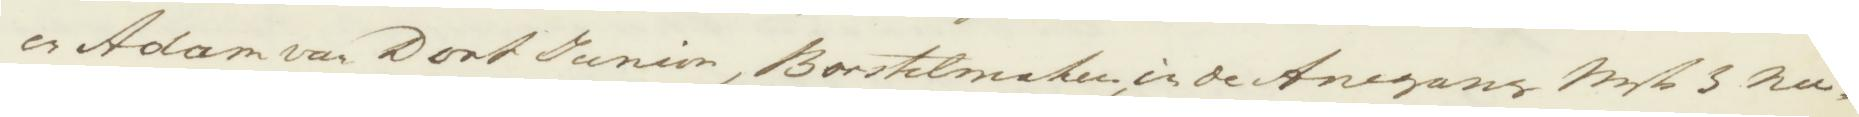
en Adam van Dort Iunior, Borstelmaker, in de Anegang Wyk 5 nu„
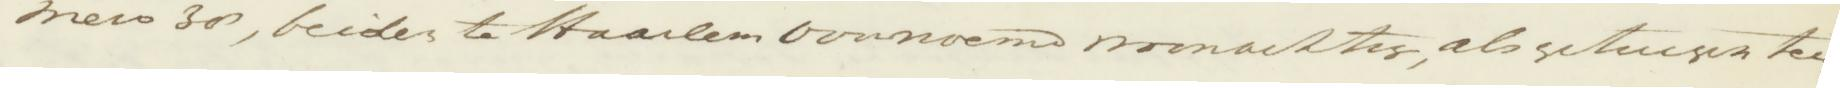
mero 38, beiden te Haarlem voornoemd woonachtig, als getuigen ten
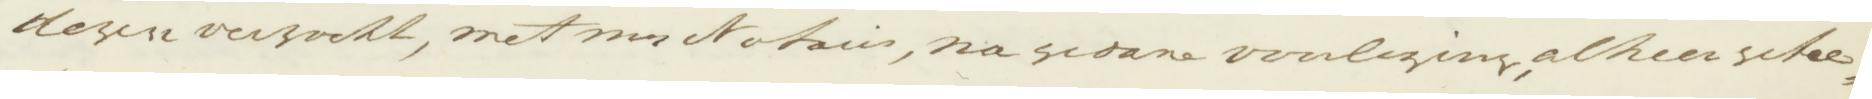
dezen verzocht, met my Notaris, na gedane voorlezing, alhier getee=
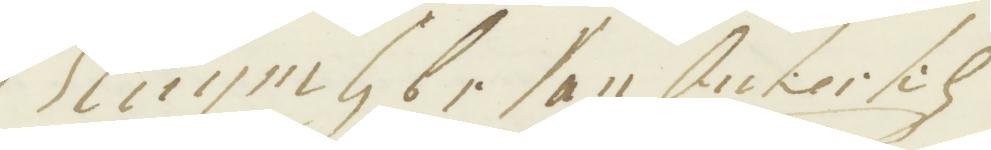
J Pluym Gbr Van Oukerk
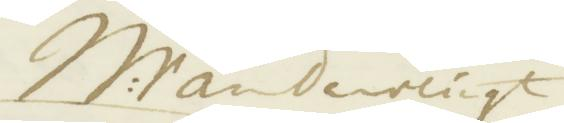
M: van dervlugt
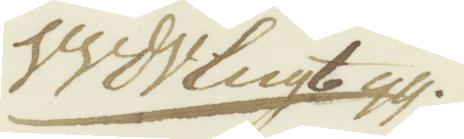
VVDVlugt qq
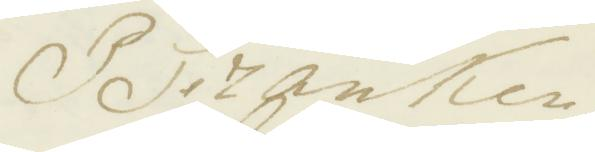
P Franken
